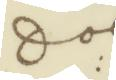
d:os
